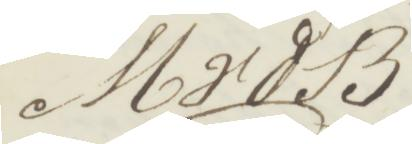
M vd B
